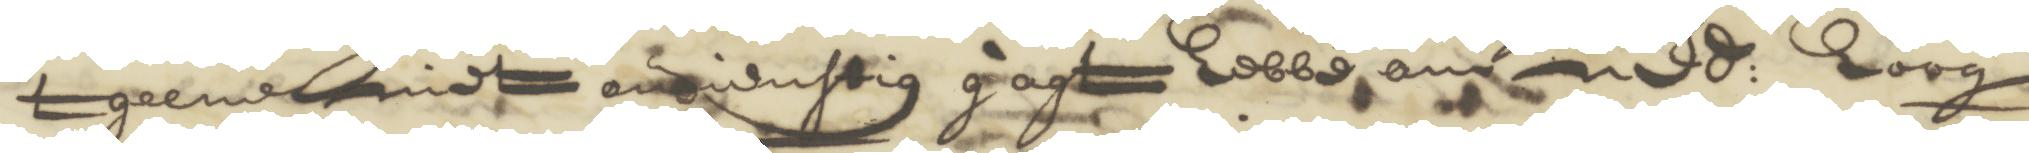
't geene niet ondienstig g' agt hebbe om uEd: hoog
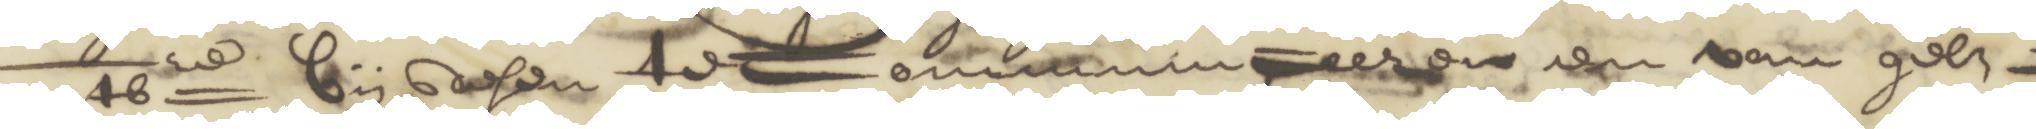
agtb=e bij desen te Communiceeren en van gelijk
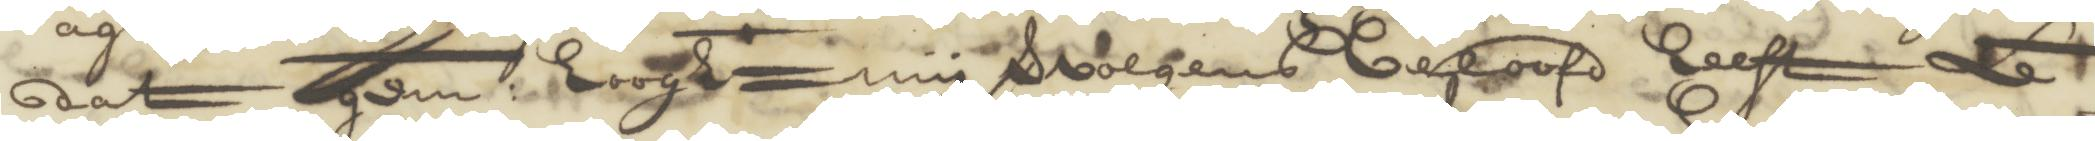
dat gem: hoogh=t mij vervolgens beloofd heeft te
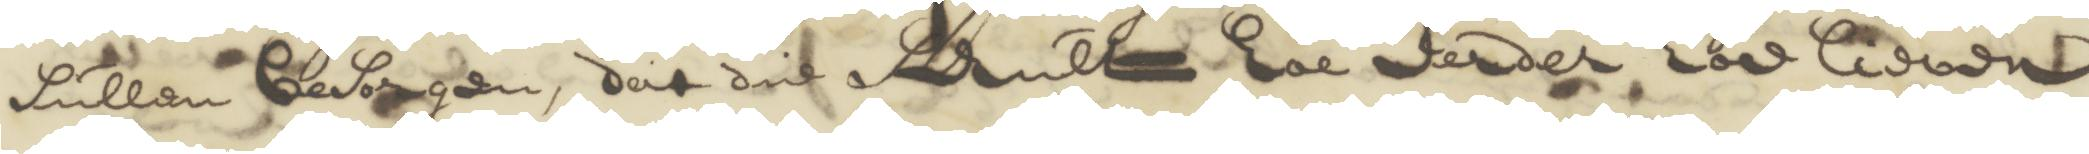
sullen besorgen, dat die Schult hoe Eerder, hoe liever
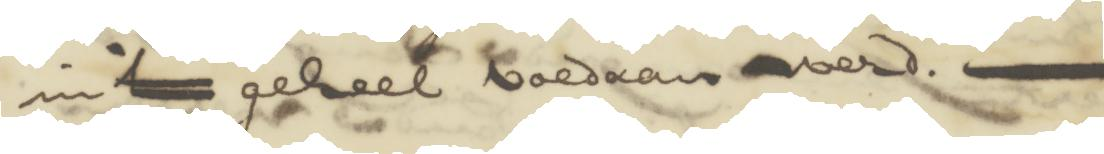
in’t geheel voledaan werd.—
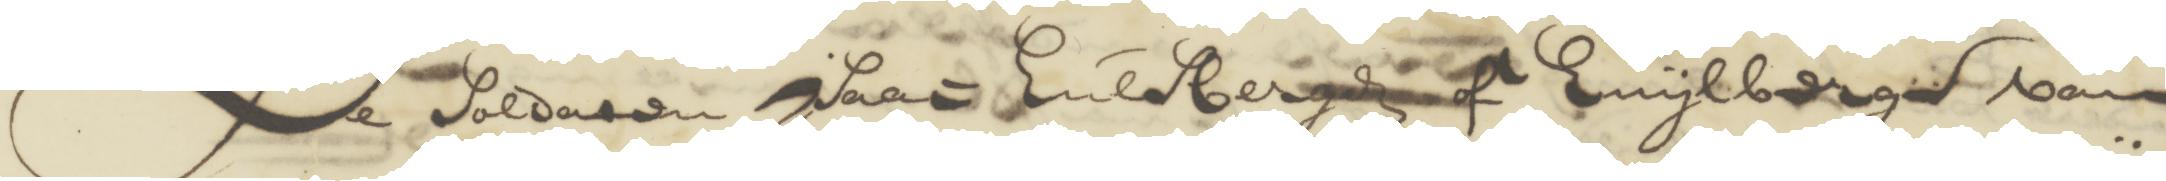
De soldaten Jsaac hulsbergen of huijlberge van
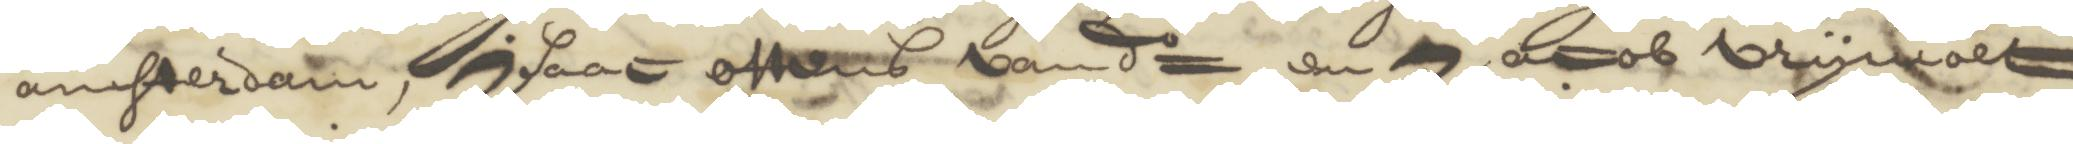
amsterdam, Jsaac ottens van d=o en Jacob vrijmoet
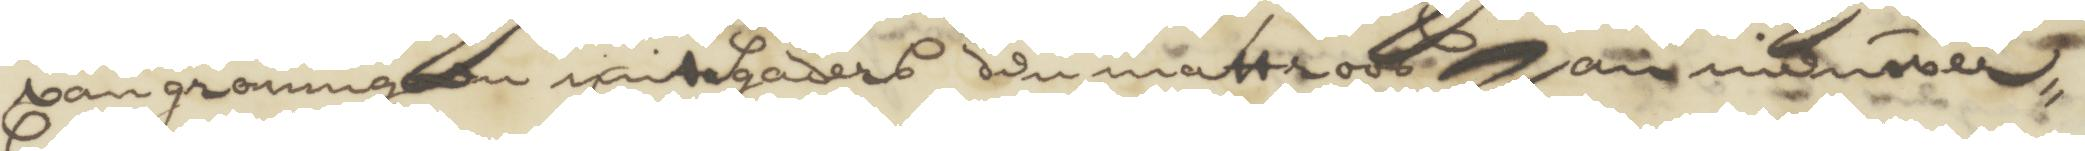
van groningen mitsgaders den mattroos Jan nieuwer„
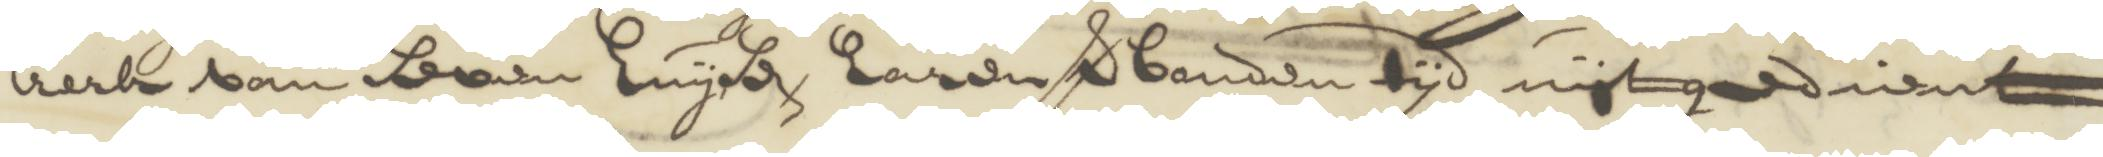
kerk van Sevenhuijsen haren verbonden tijd uijt gedient
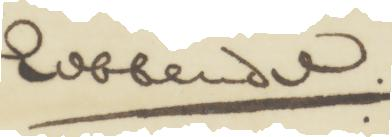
hebbende.
